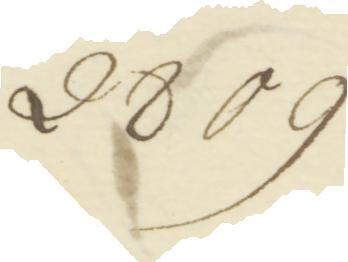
2809
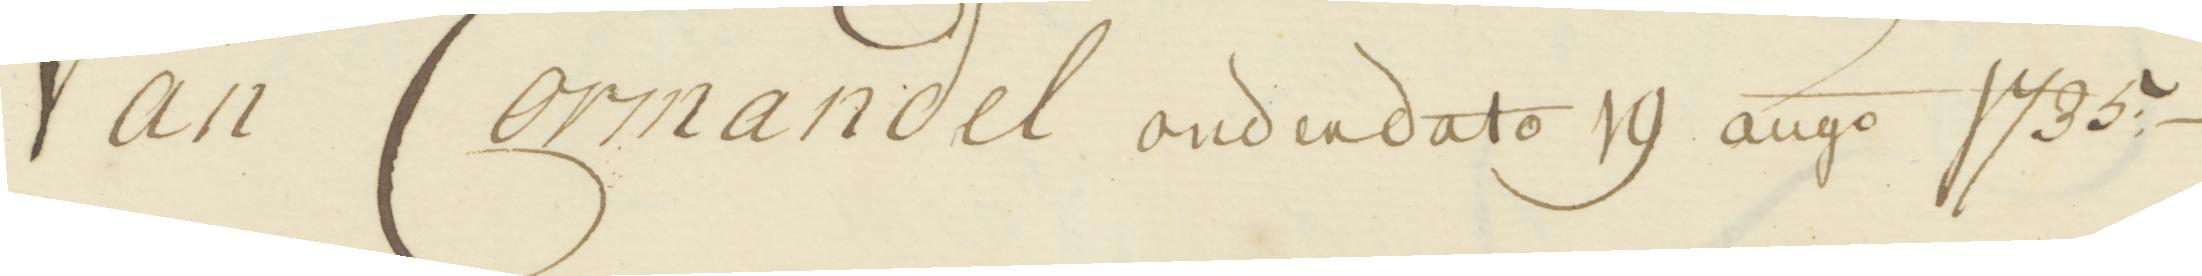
Van Cormandel onderdato 19 augo 1735:—
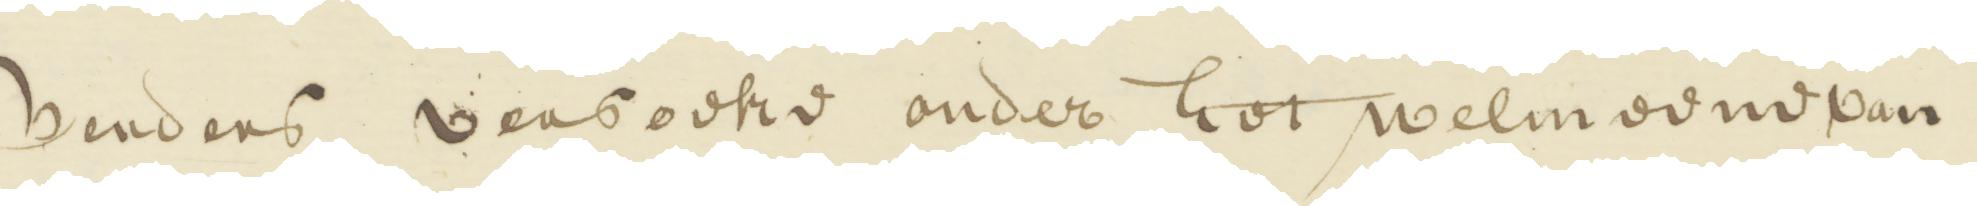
verders versoeke onder het welmeene van
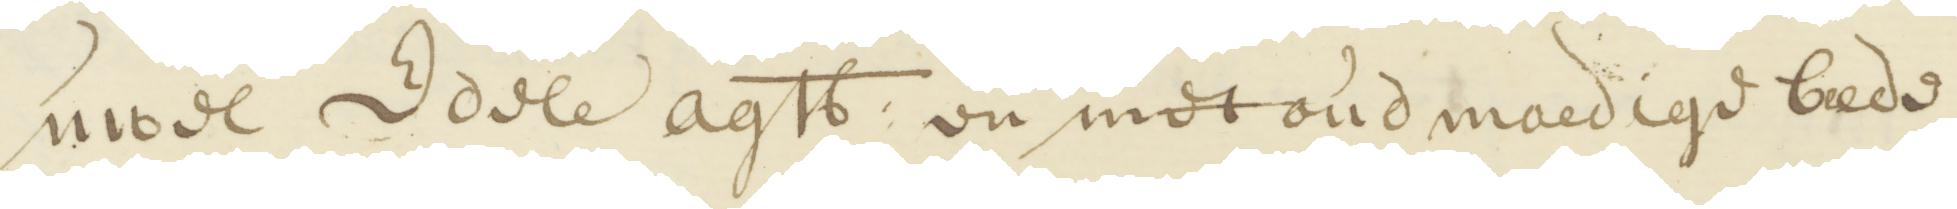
uwel Edele agtb: en met oud moedige beede
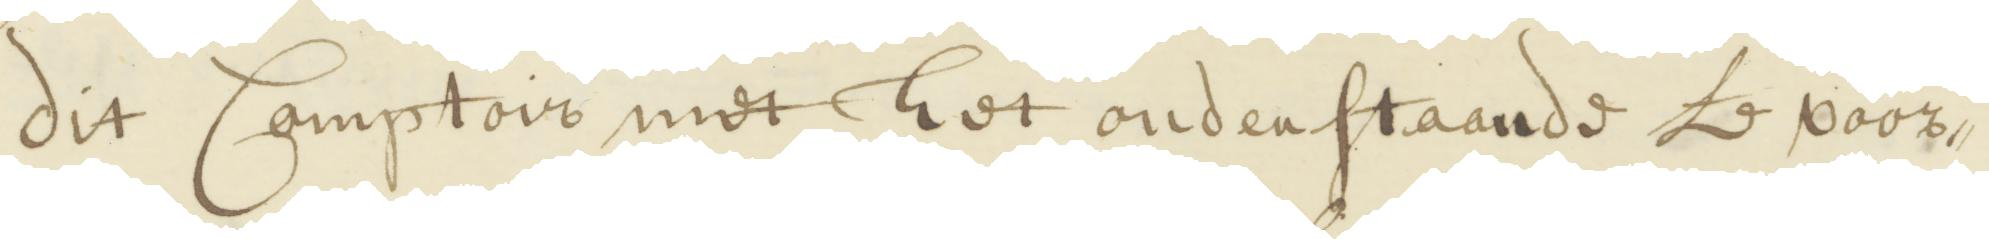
dit Comptoir met het onderstaande te voor„
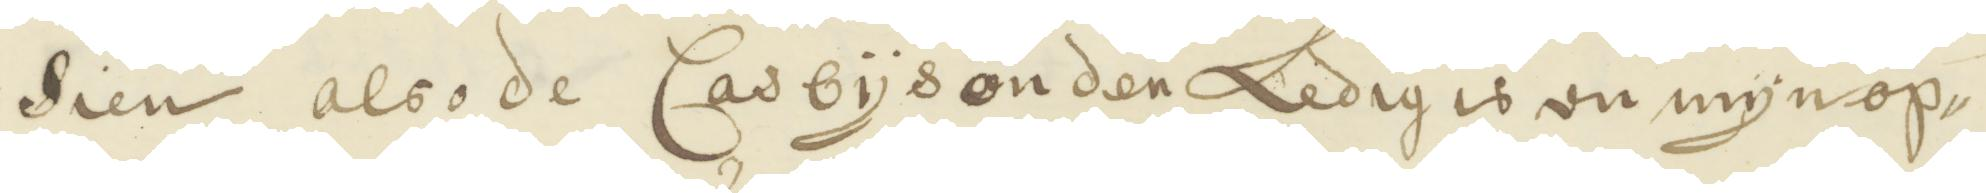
sien also de Cas bijsonder Ledig is en mijn op„
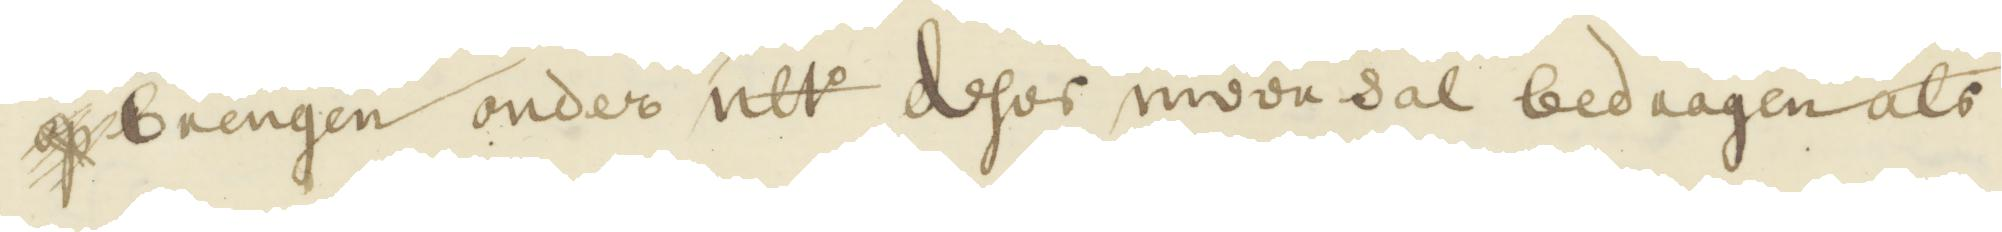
op brengen onder ulto deses meer sal bedragen als
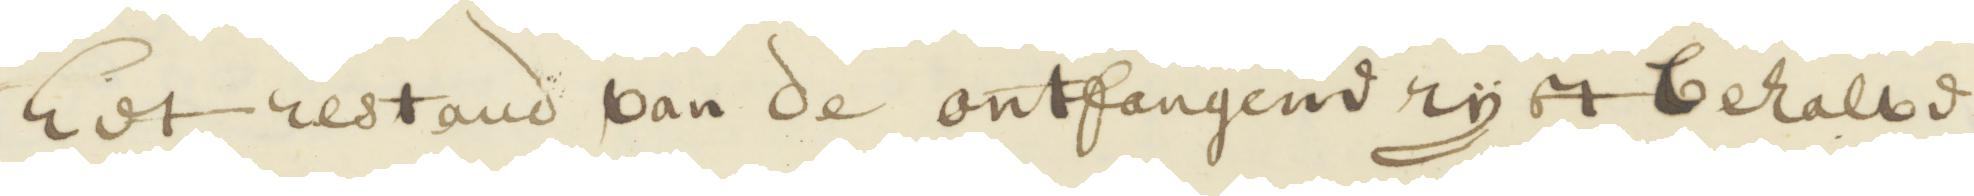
het restand van de ontfangene rijst behalve
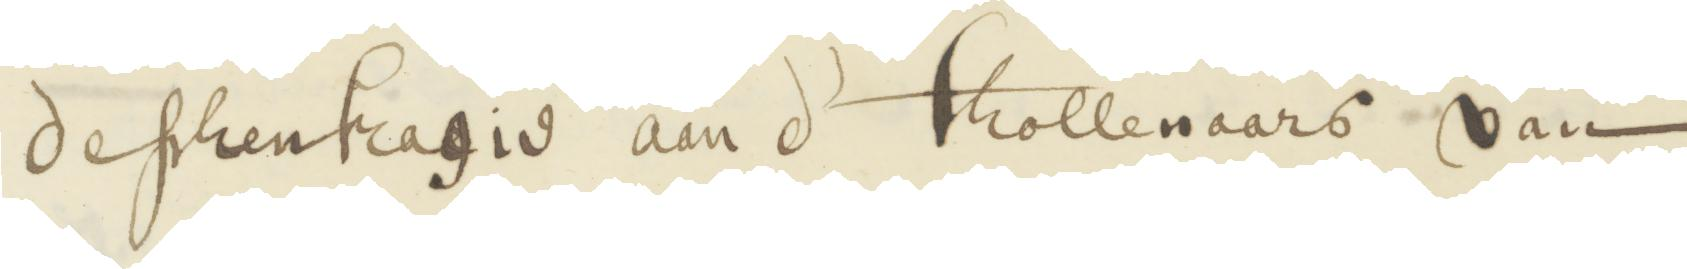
de schenkagie aan d’ thollenaars van
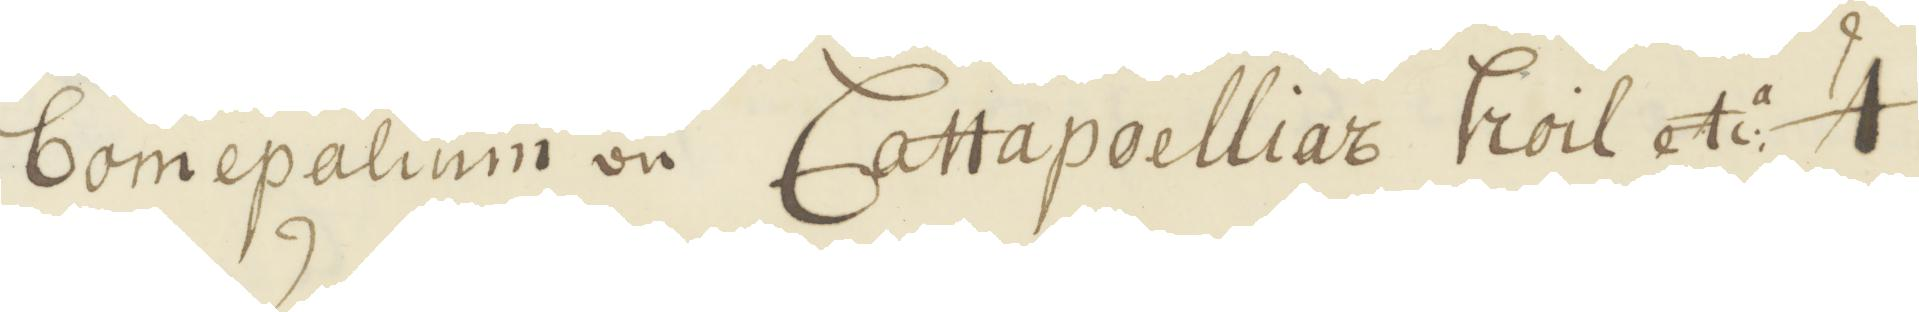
bomepalium en Cattapoelliar koil etc:a 't
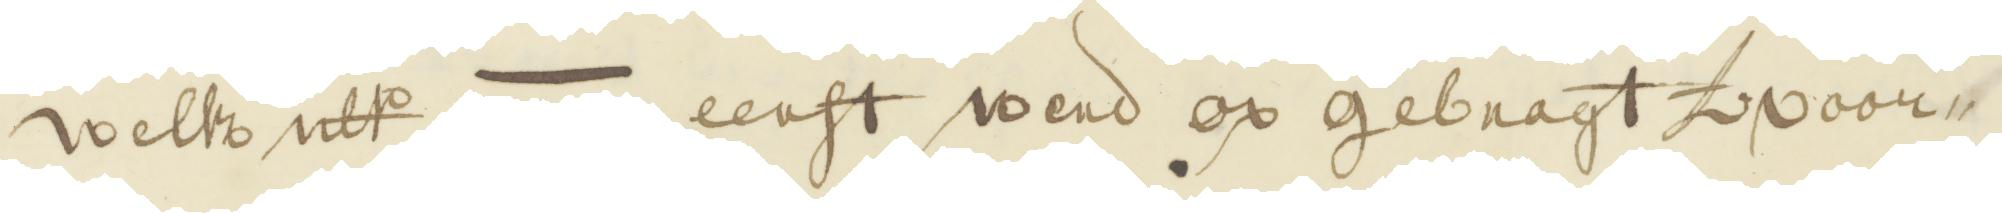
welk ulto aug: eerst werd op gebragt te voor„
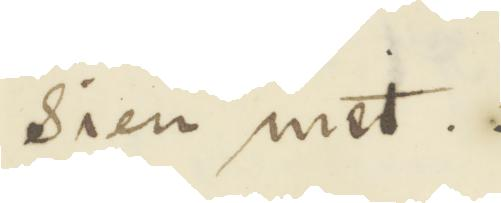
sien met. —
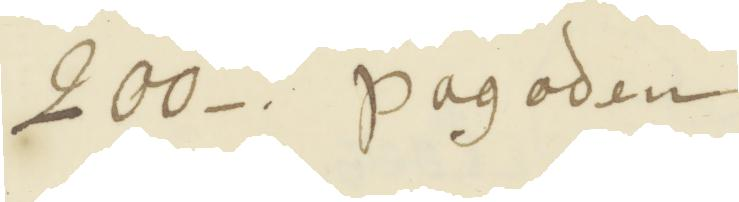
200 —. pagoden
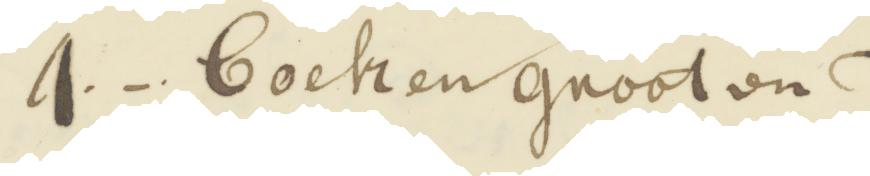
4. —. boeken groot en
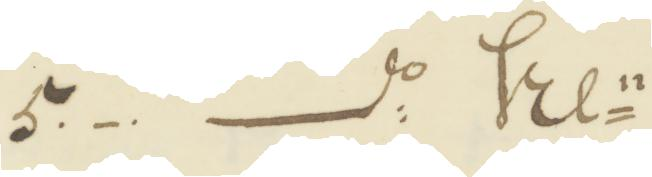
5. —. _:o kl=n
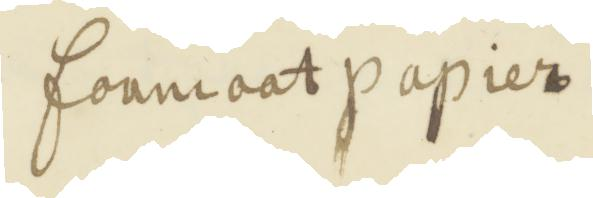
formaat papier
